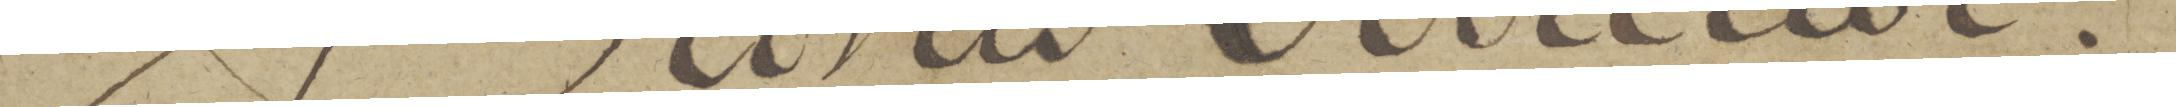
Javas-Oostcust.
